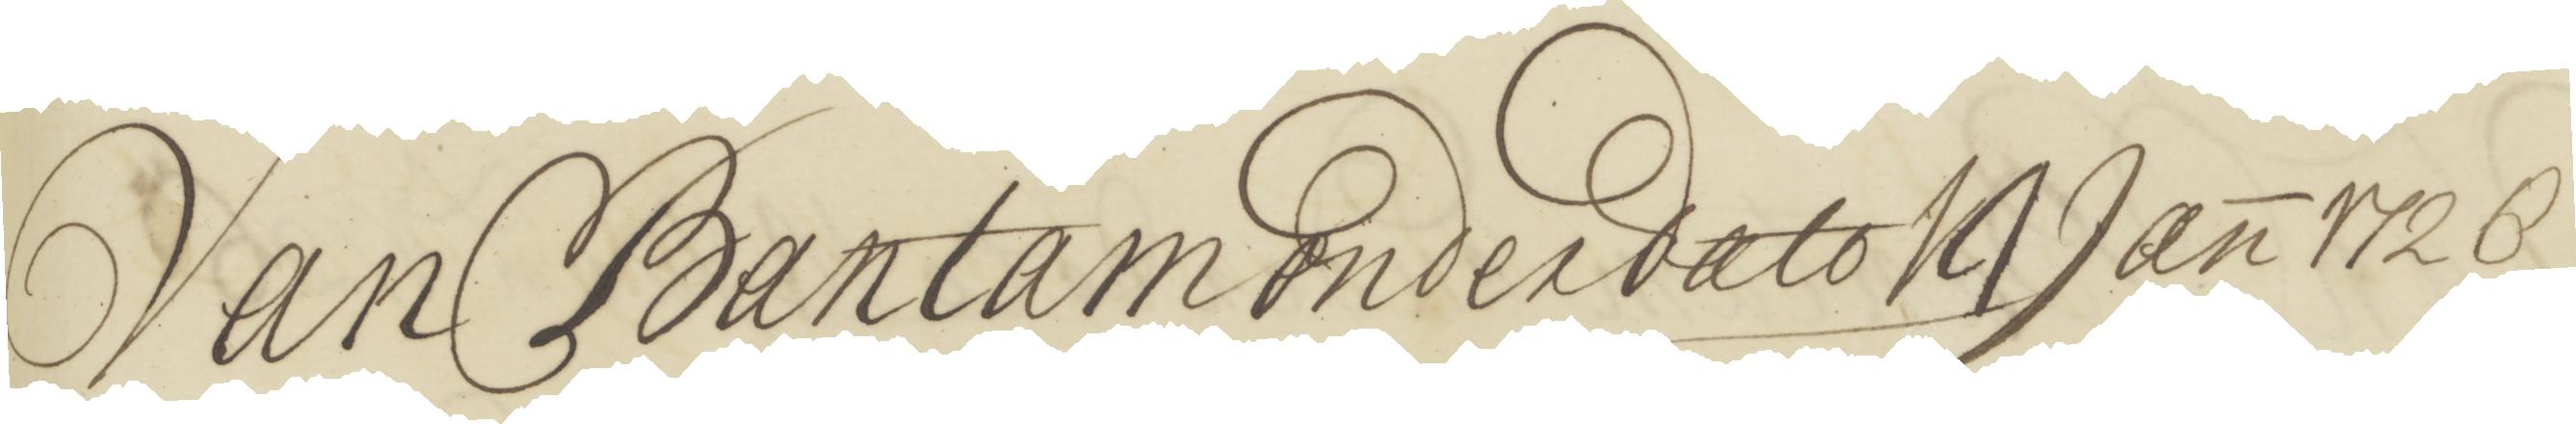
Van Bantam onder dato 14 Jan 1726
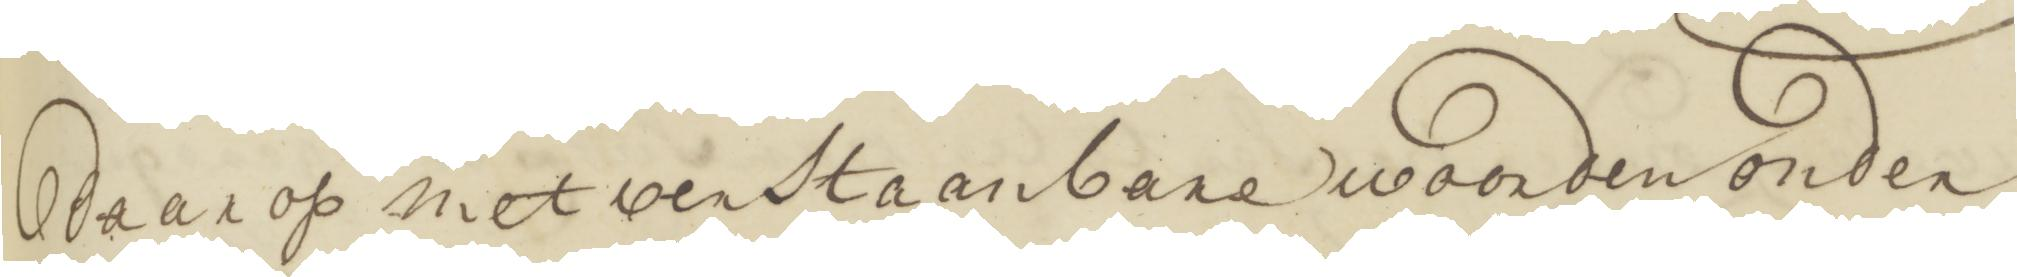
daar op met verstaanbare woorden onder
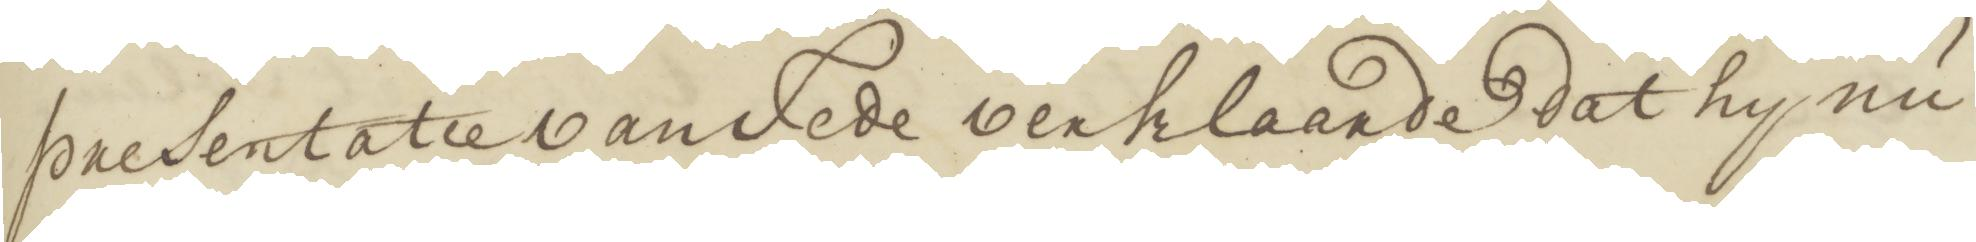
presentatie van Eede verklaarde dat hy nu
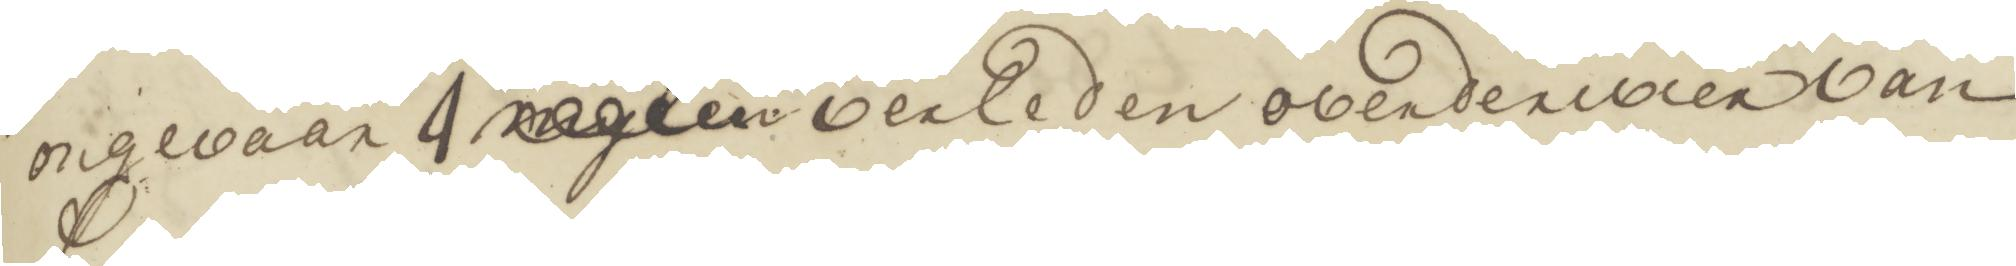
ongevaar 4 verleden over de rivier van
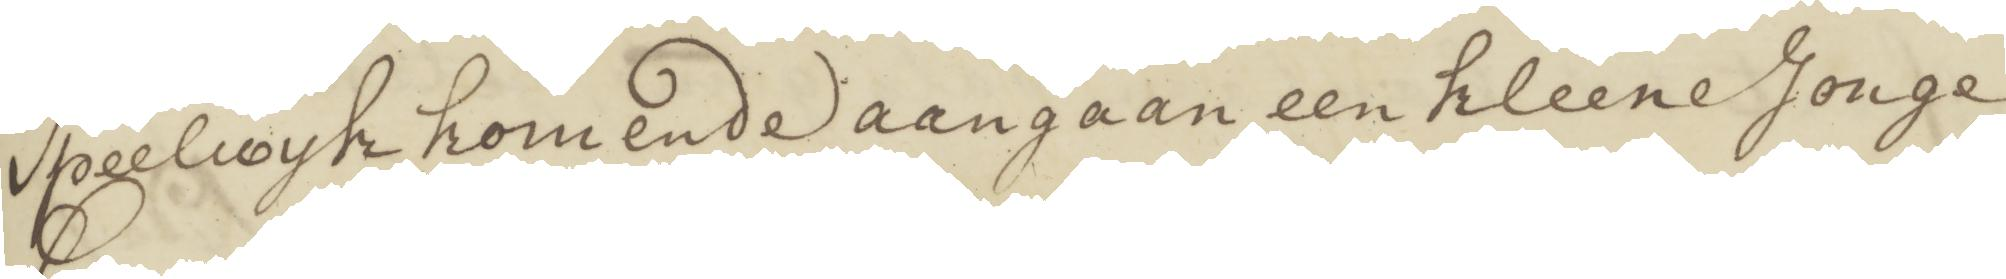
Speelwyk komende aangaan een kleene Jonge
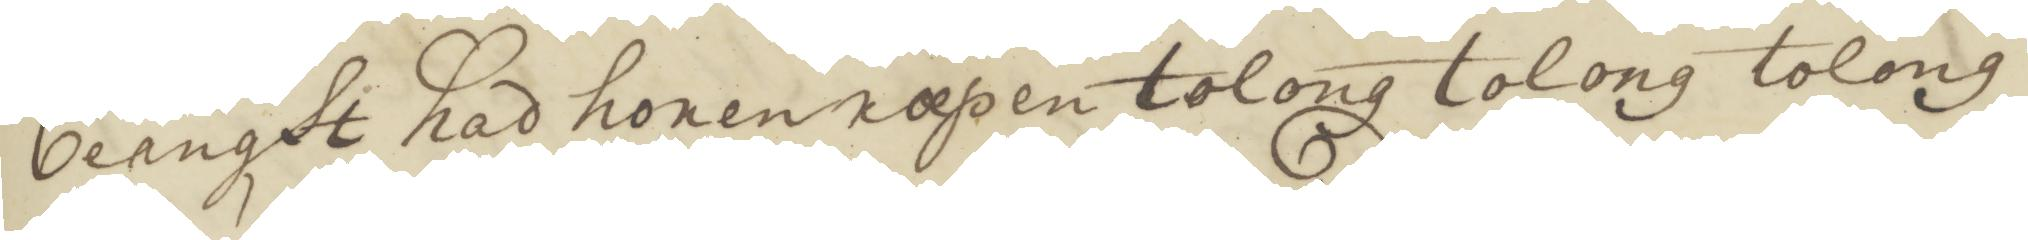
beangst had horen roepen tolong tolong tolong
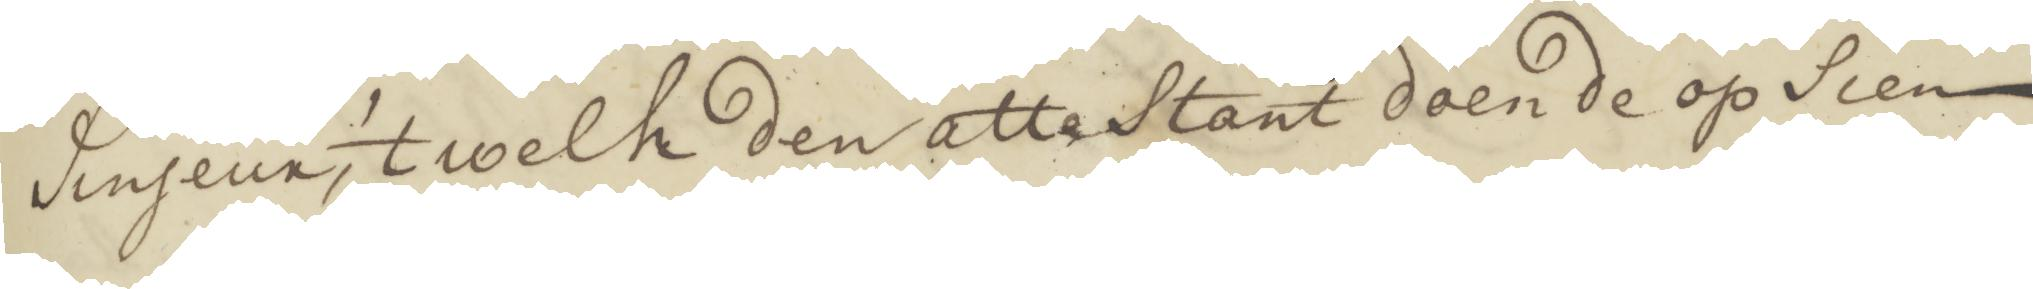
sinjeur, ’t welk den attestant doen de op sien
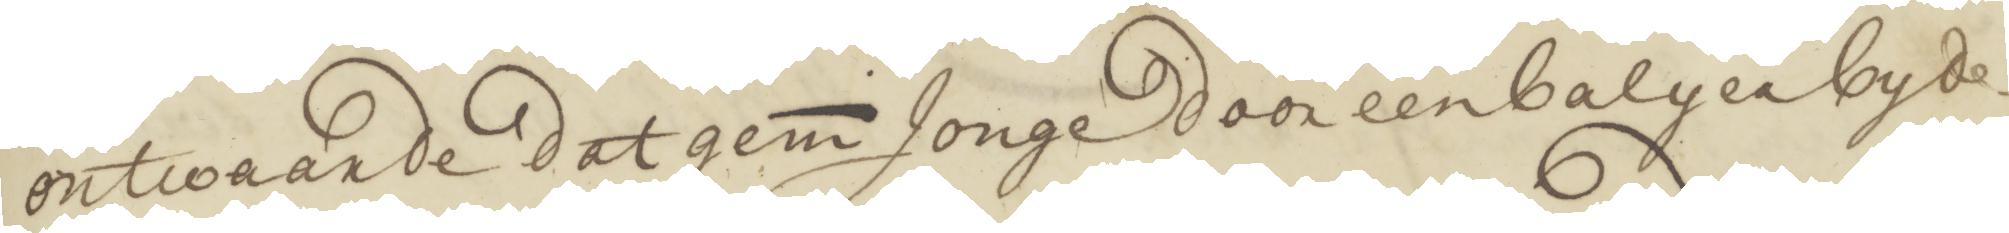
ontwaarde dat gem jonge door een balyer by de
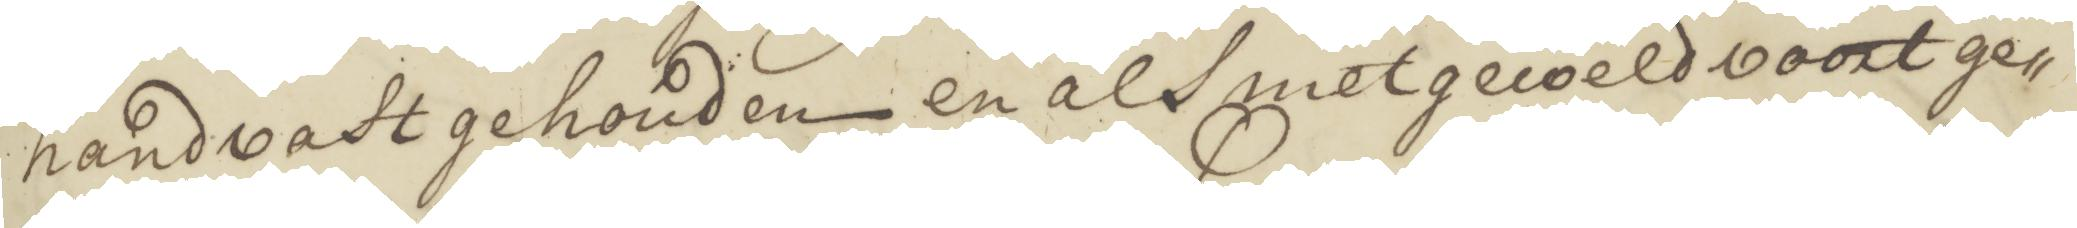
hand vast gehouden en als met geweld voort ge„
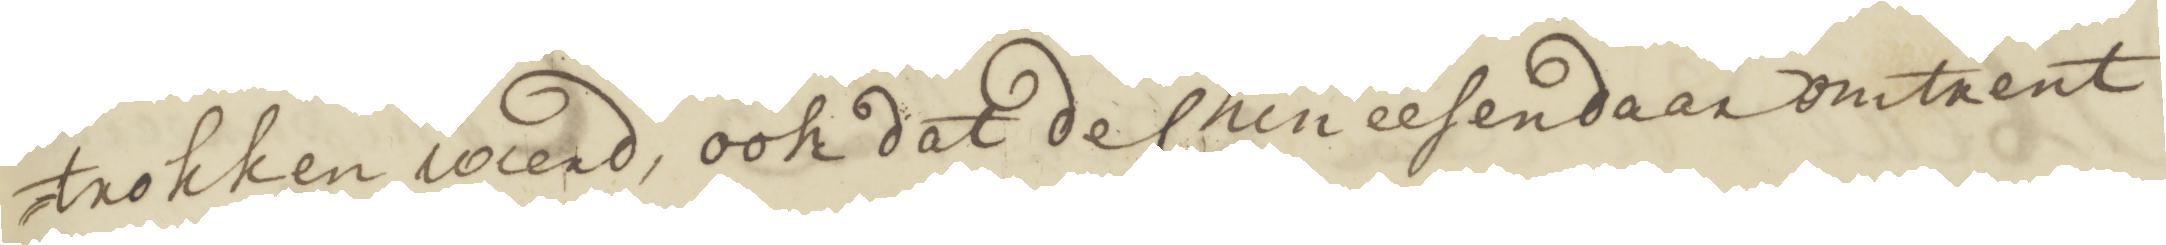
„trokken wierd, ook dat de Chineesen daar omtrent
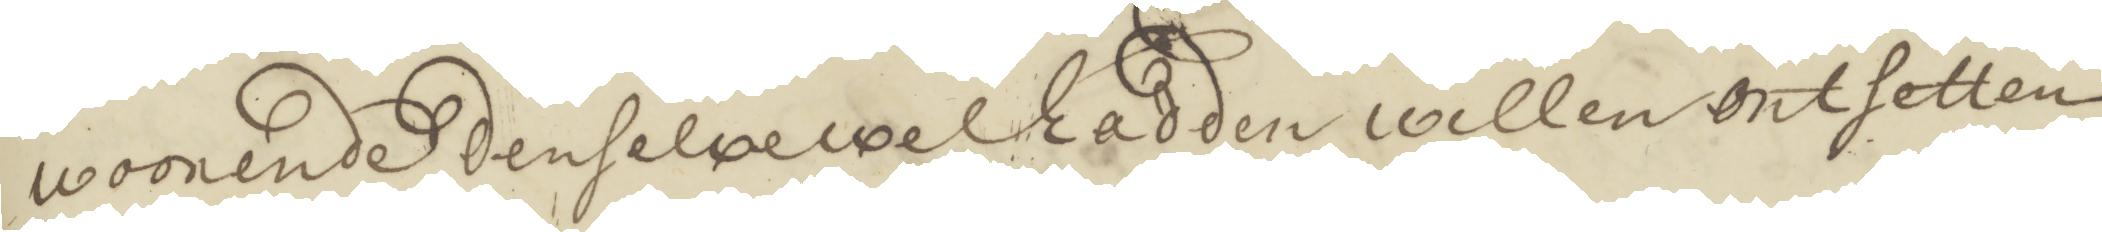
woonende denselve wel hadden willen ontsetten
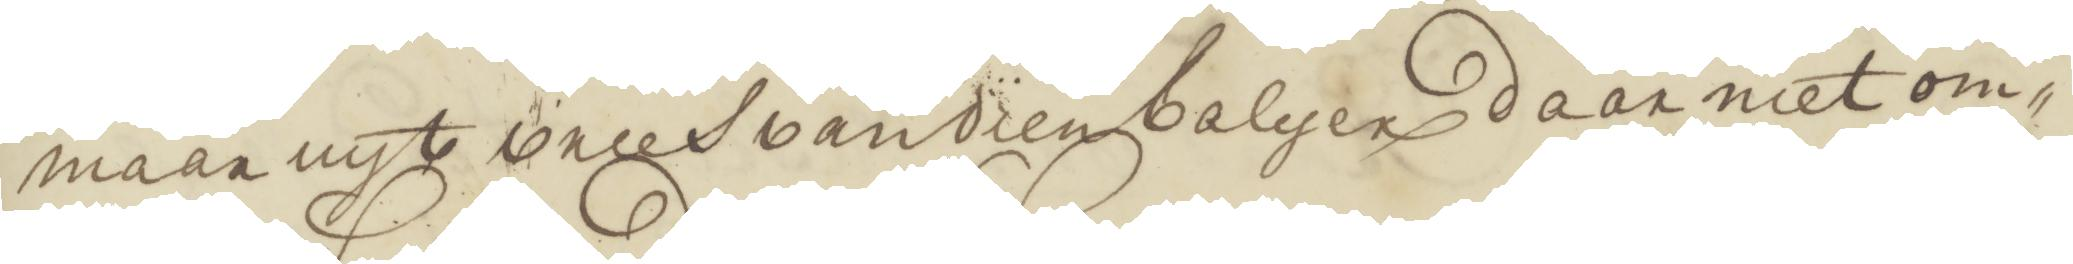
maar uyt vrees van dien balyer daar niet om„
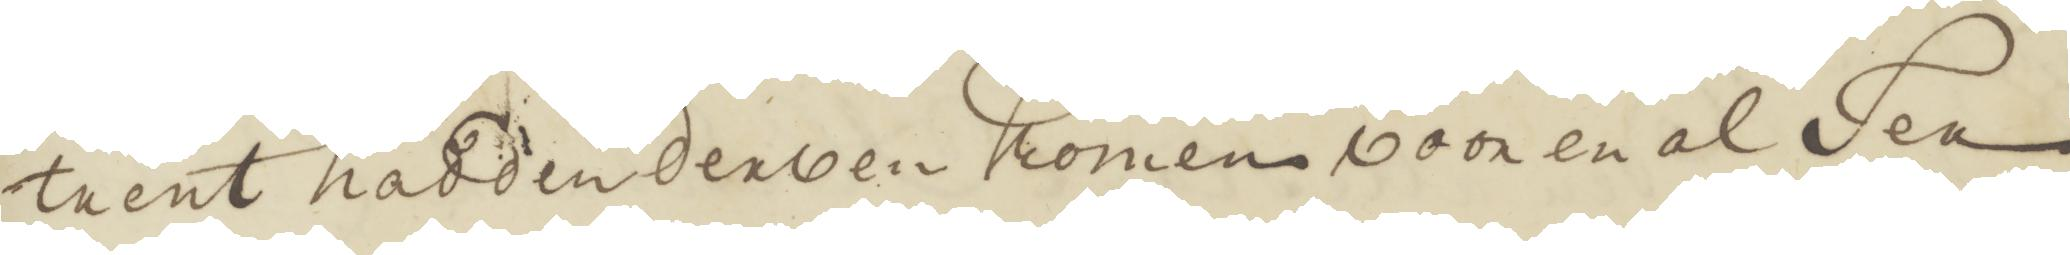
trent hadden derven komen voor en al Eer
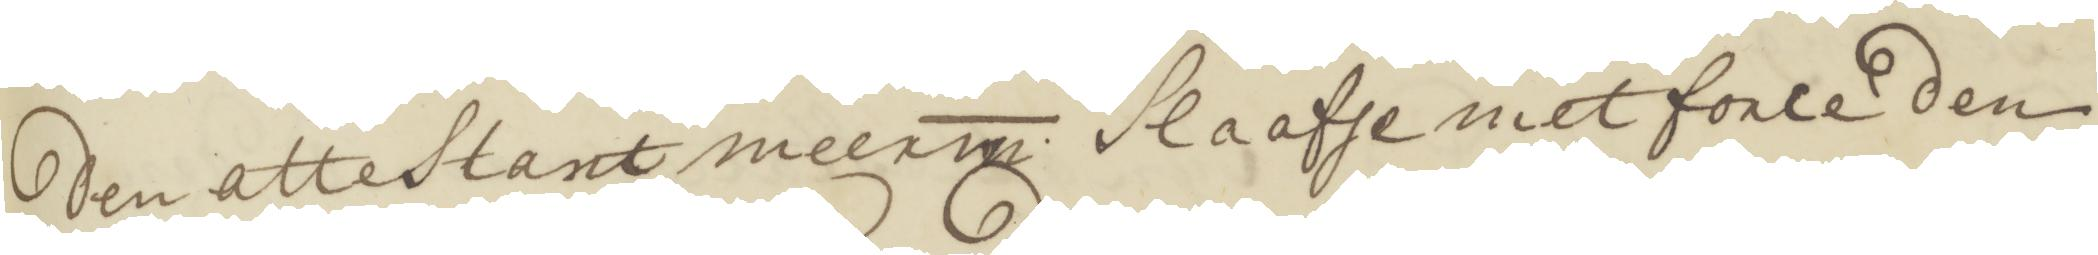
den attestant meerm. slaafje met force den
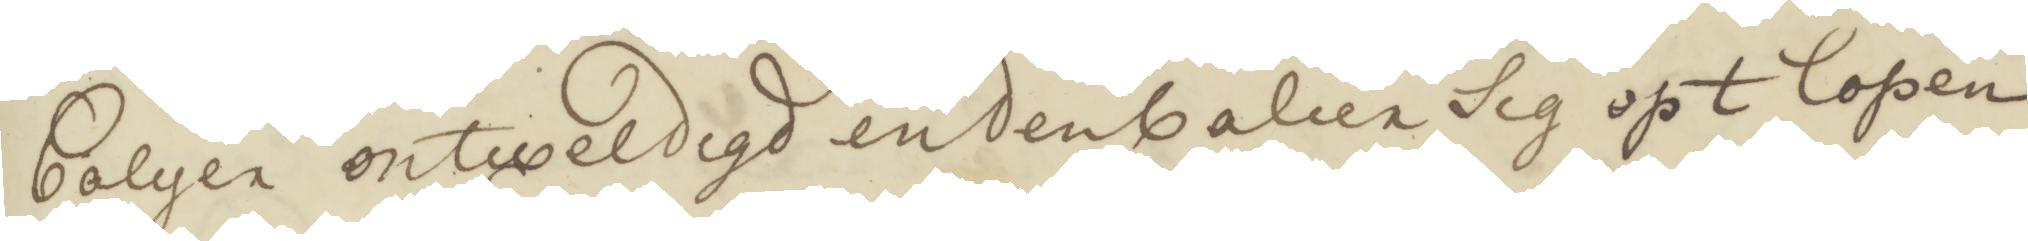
balyer ontweldigd en den balier sig opt lopen
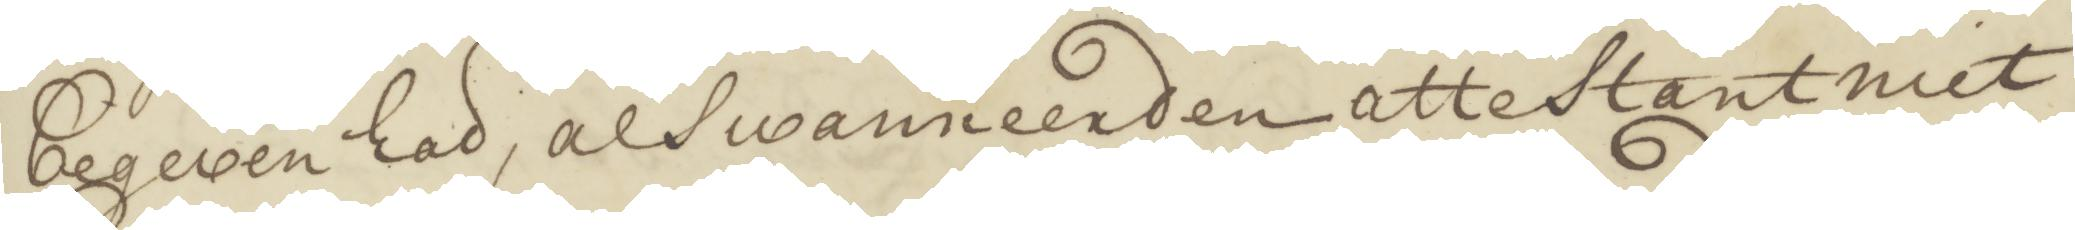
begeven had, als wanneer den attestant niet
